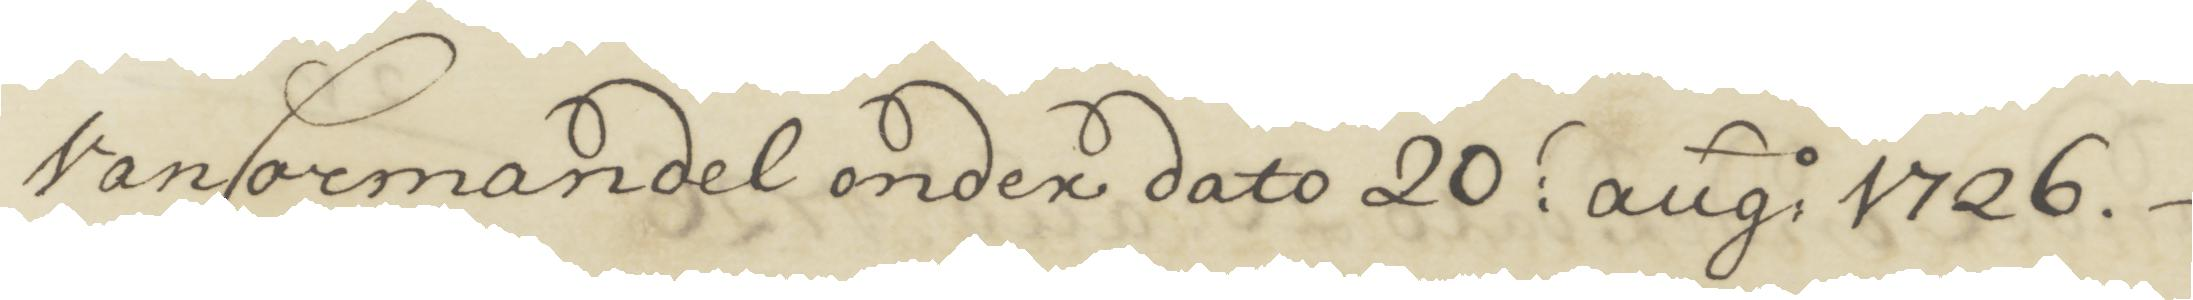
Van Cormandel onder dato 20:' aug:o 1726. —
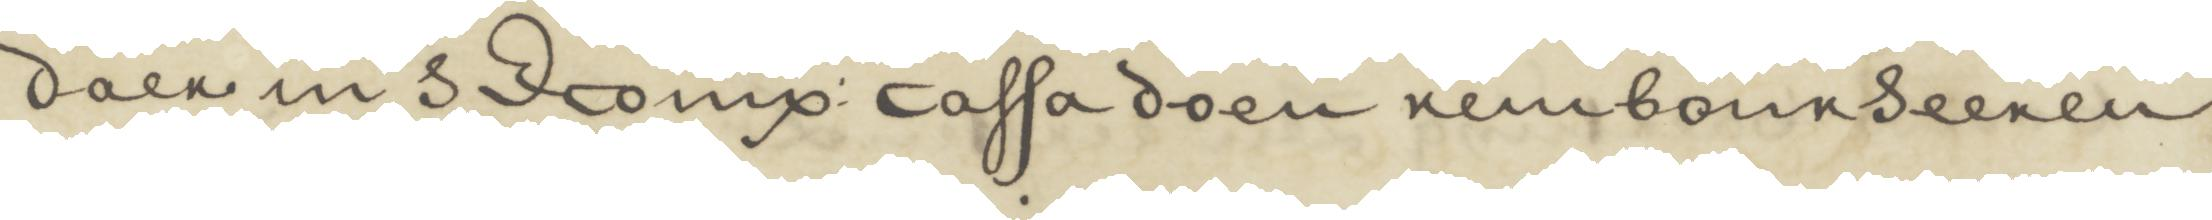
daer in ’s Ecomp: cassa doen rembourseeren
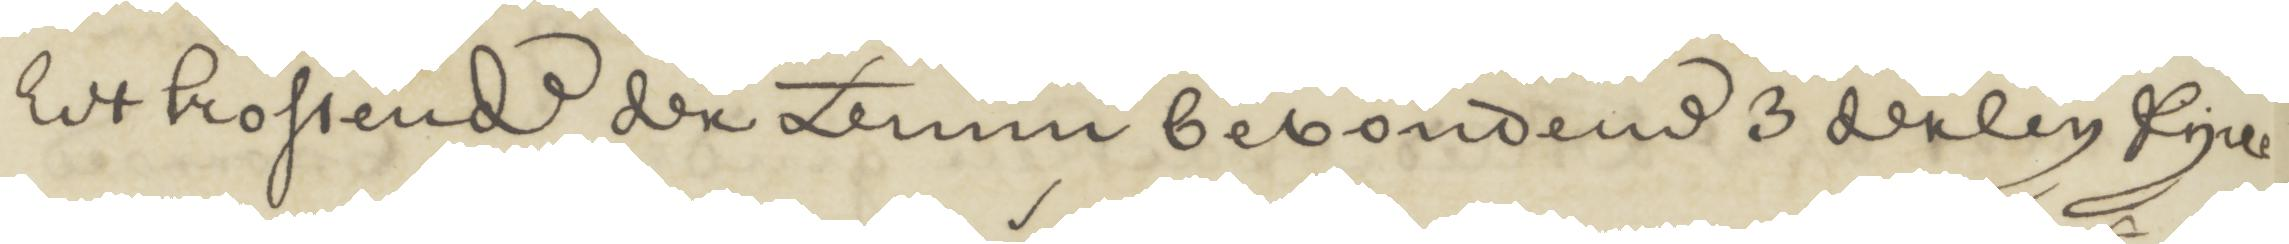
het kostende der temin bevondene 3 derleij fijne
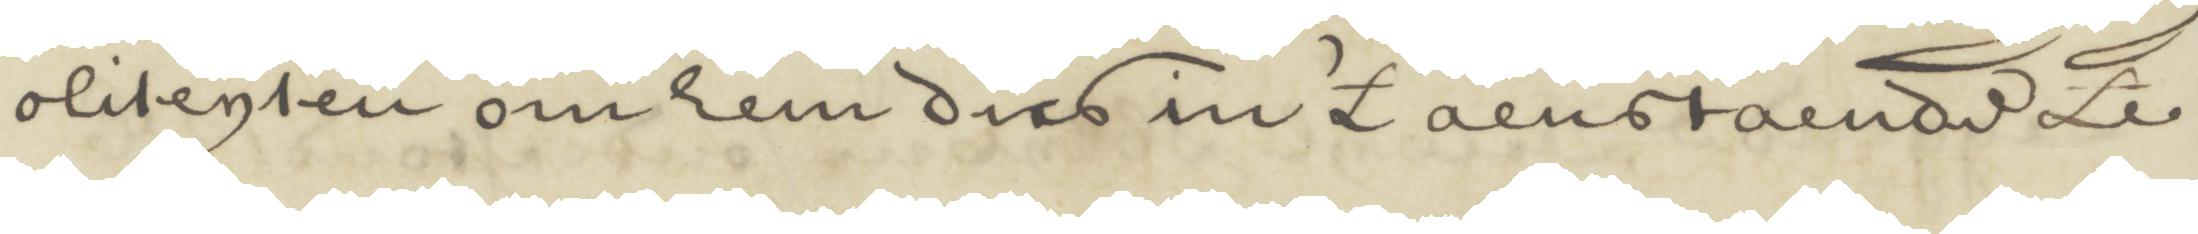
oliteijten om hem dus in 't aenstaende te
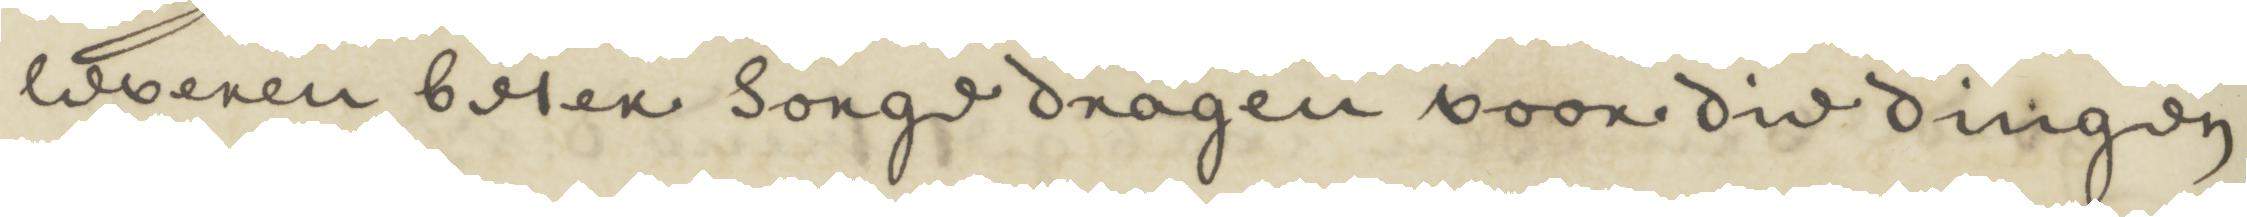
leveren beter sorge dragen voor die dingen,
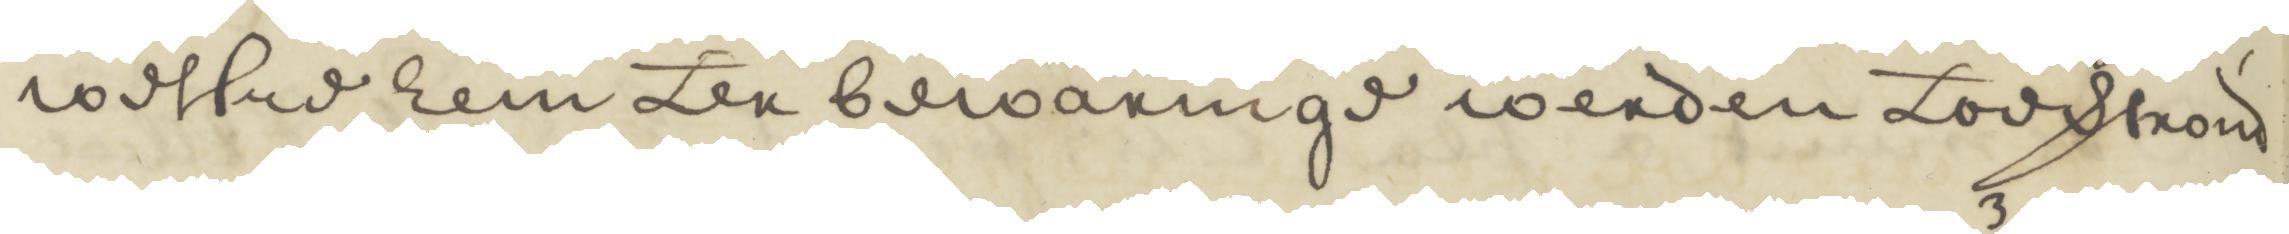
welke hem ter bewaringe werden toevertroud
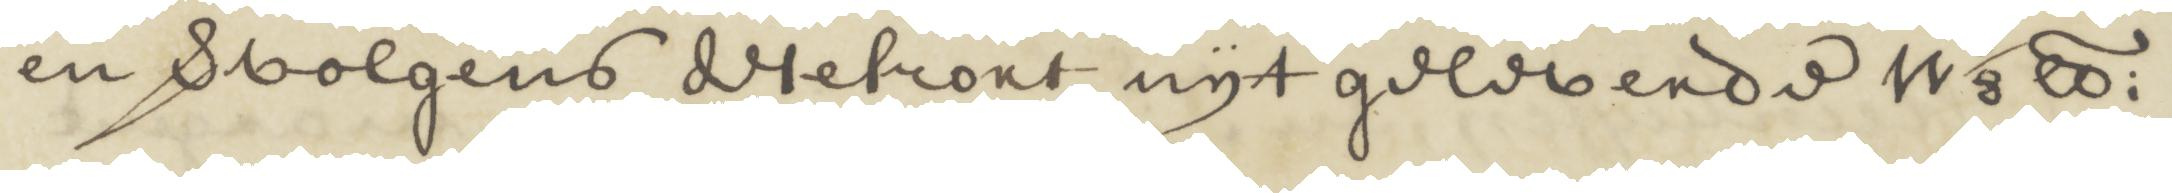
en vervolgens de tekort uijt geleverde 11 3/8 lb:
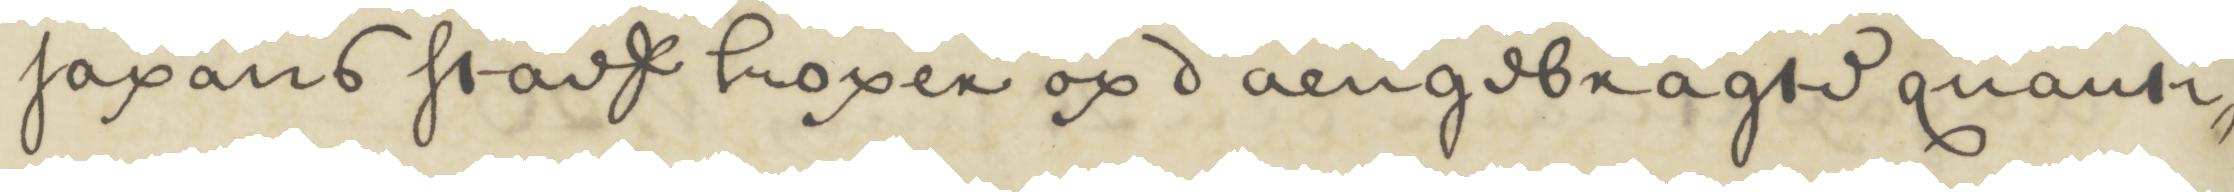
Japans staef koper op d'aengebragte quanti„
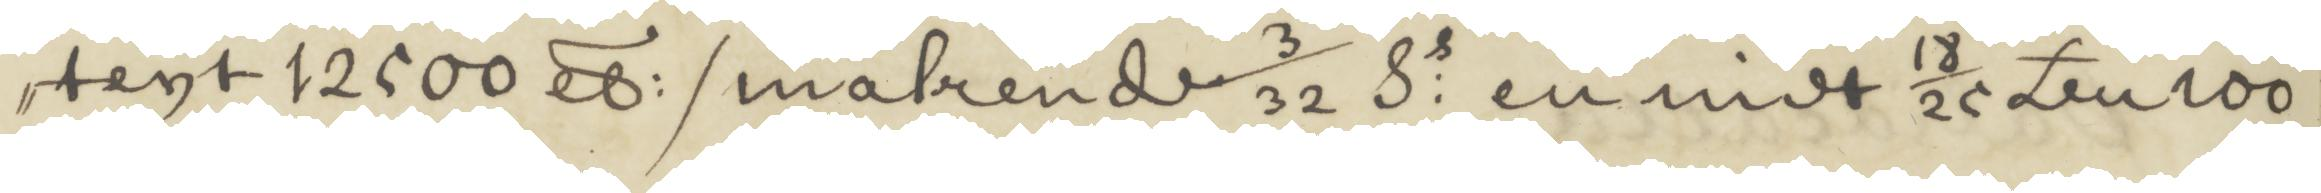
„teijt 12500 lb: / makende 3/32 S:s en niet 18/25 ten 100
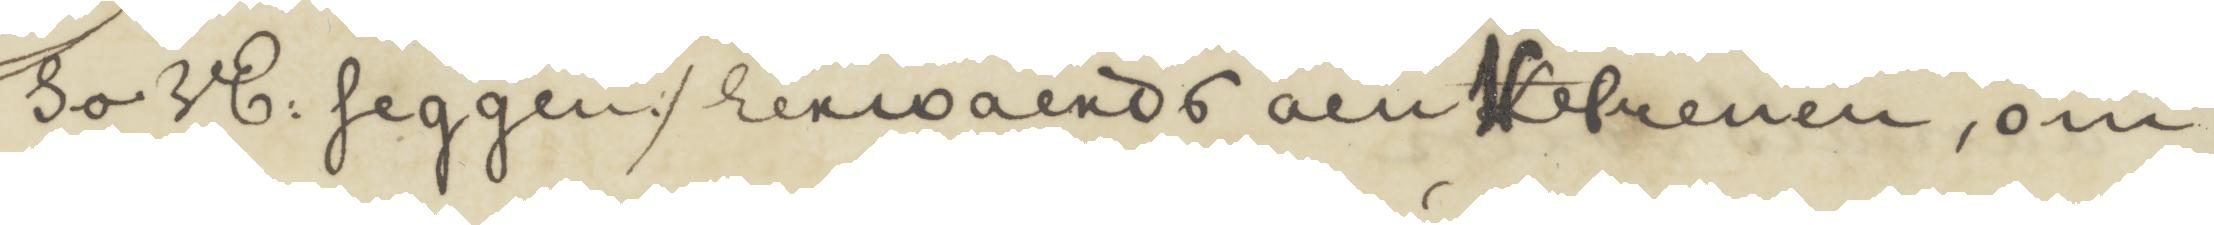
so VE: seggen :/ herwaerds aen Rekenen, om
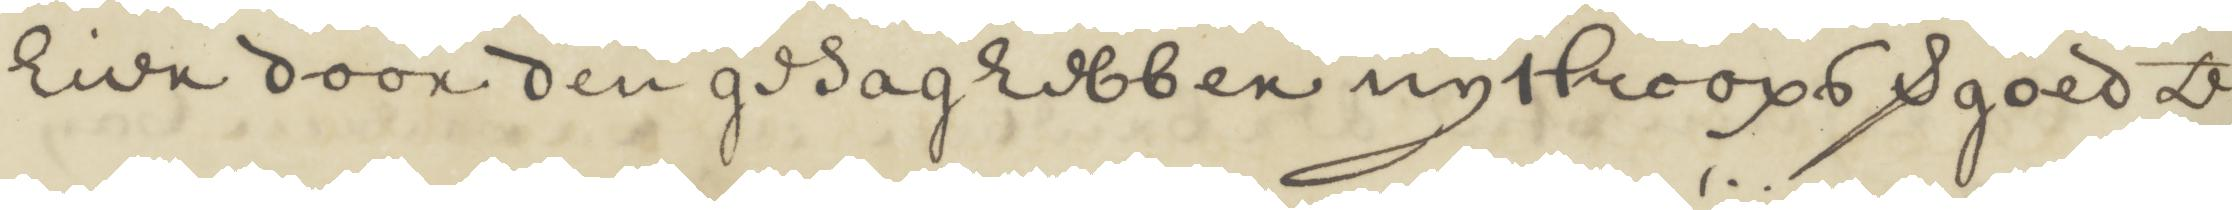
hier door den gesaghebber uijtkoops vergoed te
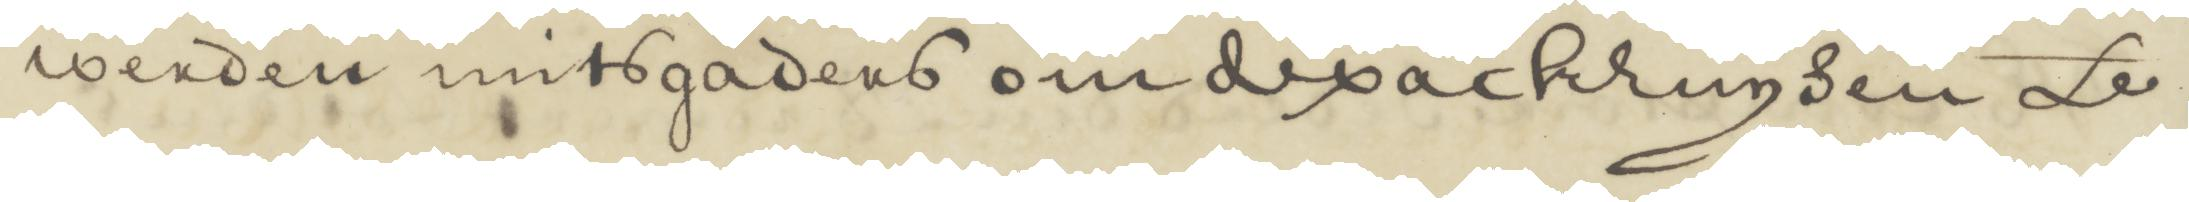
werden mitsgaders om de packhuijsen te
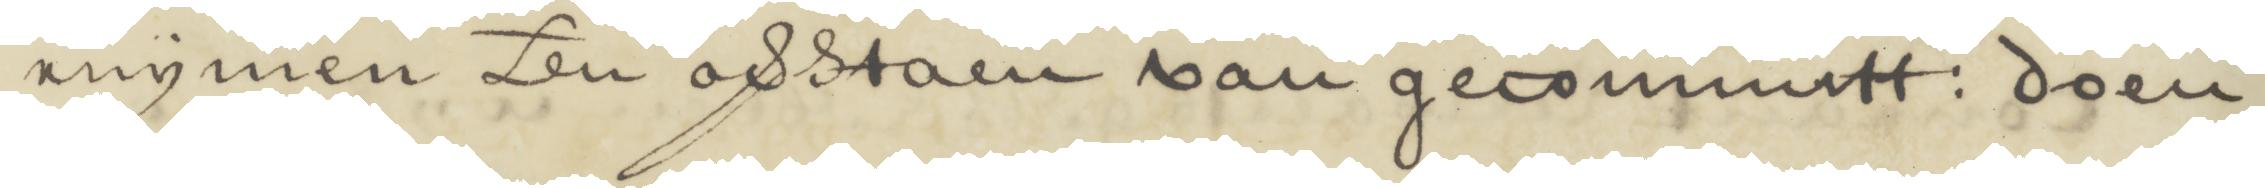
ruijmen ten overstaen van gecommitt:s doen
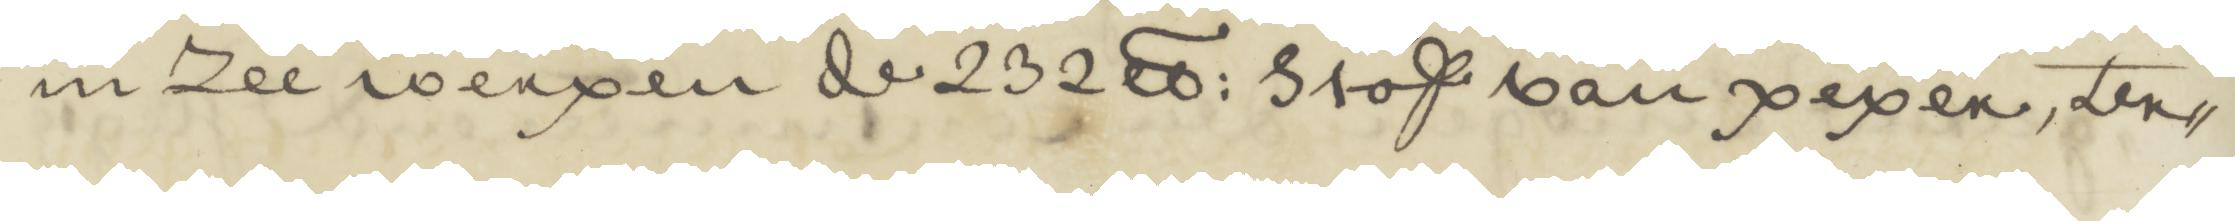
in zee werpen de 232 lb: stof van peper, ter„
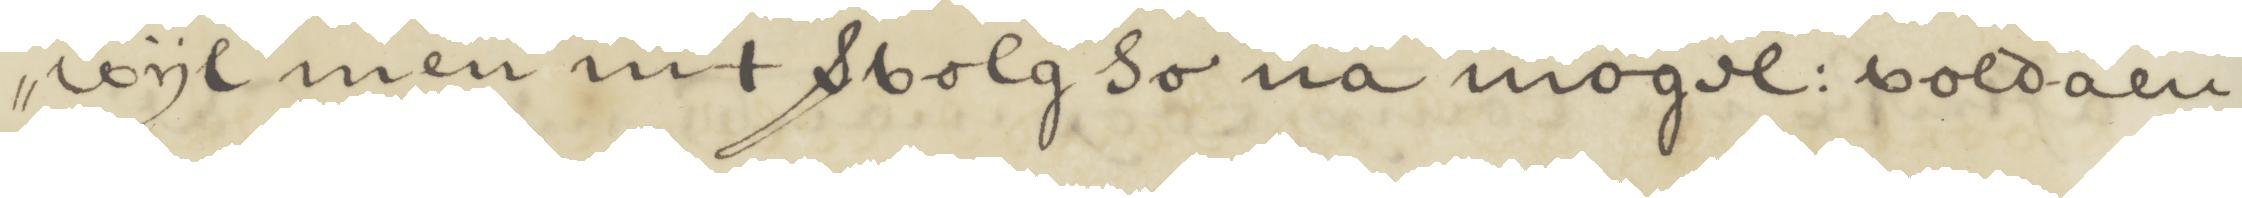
„wijl men in't vervolg so na mogel: voldaen
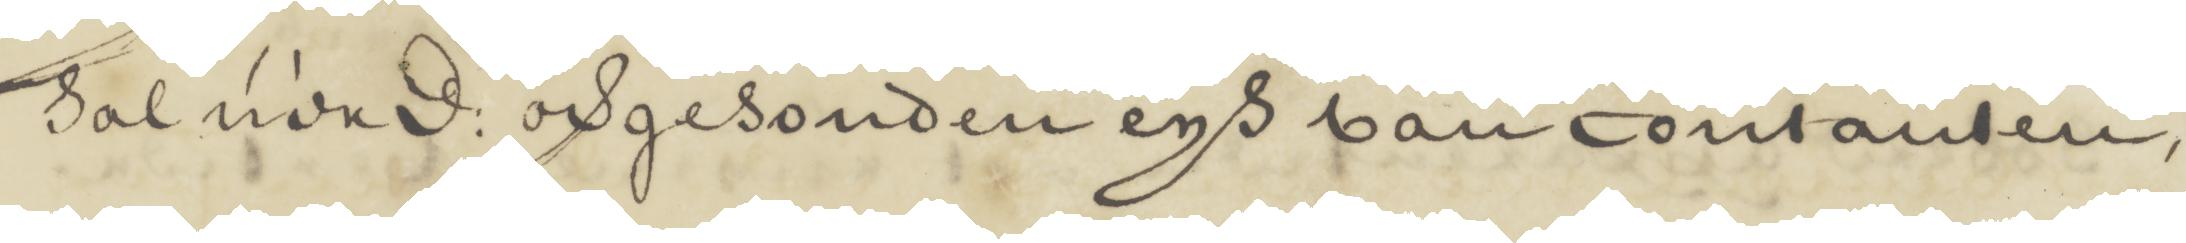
sal u'er E: overgesonden eijs van contanten,
